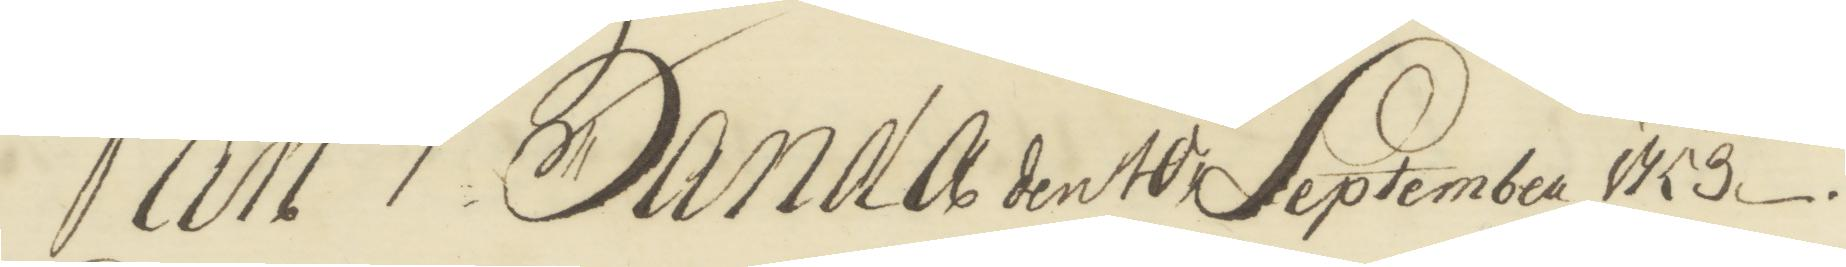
Van Banda den 10„ September 1753—.
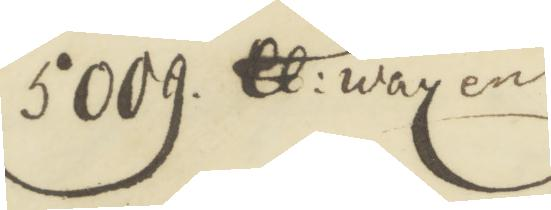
5009. lb: wax en
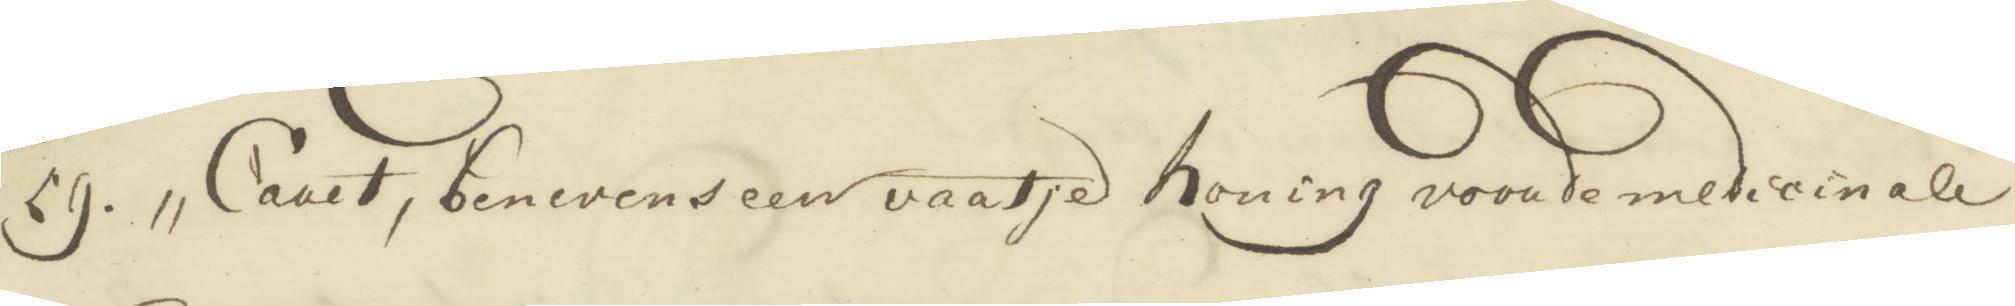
59. „ Caret, benevens een vaatje honing, voor de medicinale
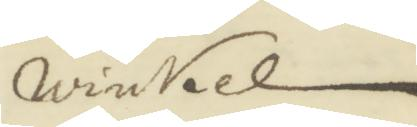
winkel
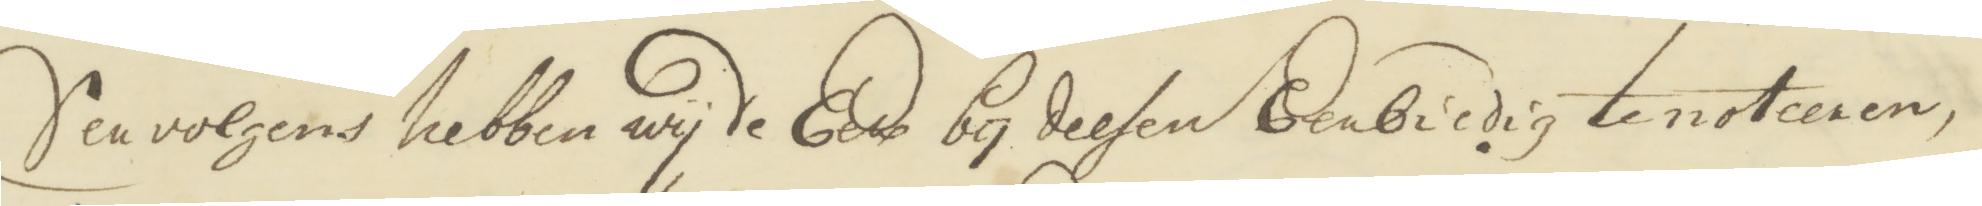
Vervolgens hebben wij de Eer bij deesen Eerbiedig te noteeren,
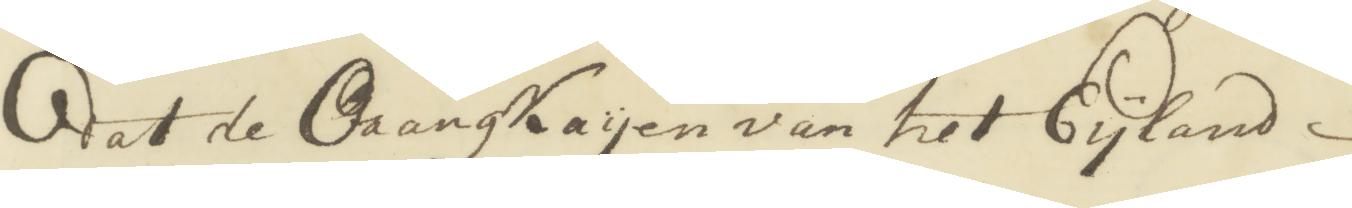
dat de Orangkaijen van het Eijland
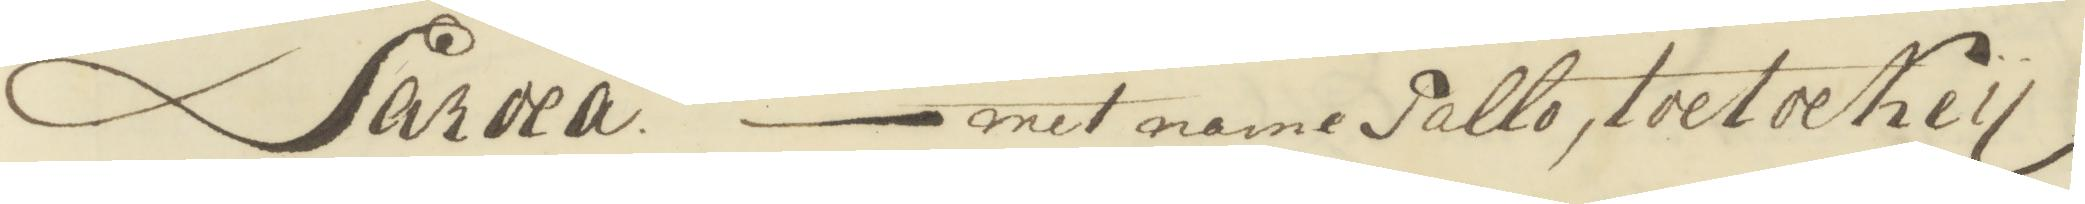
Saroea. — met name Pallo, toetoekeij
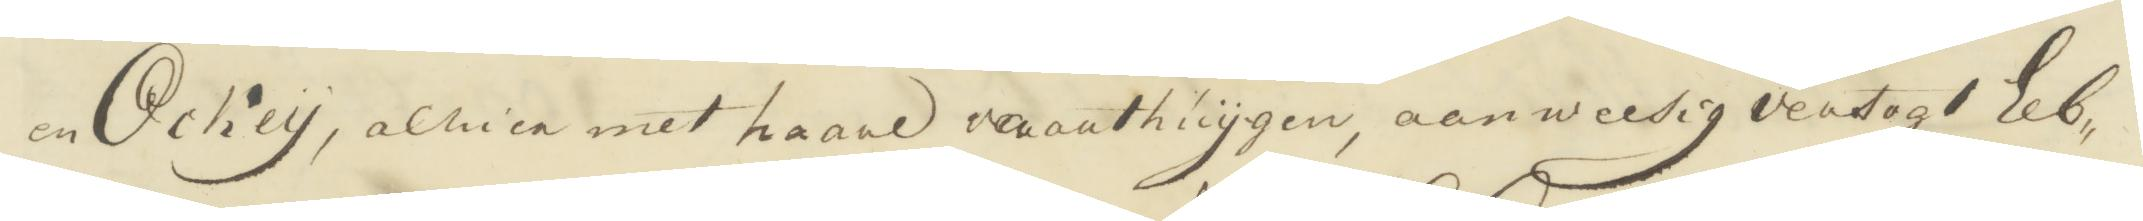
en Ockeij, alhier met haare vaarthuijgen, aanweesig versogt heb„
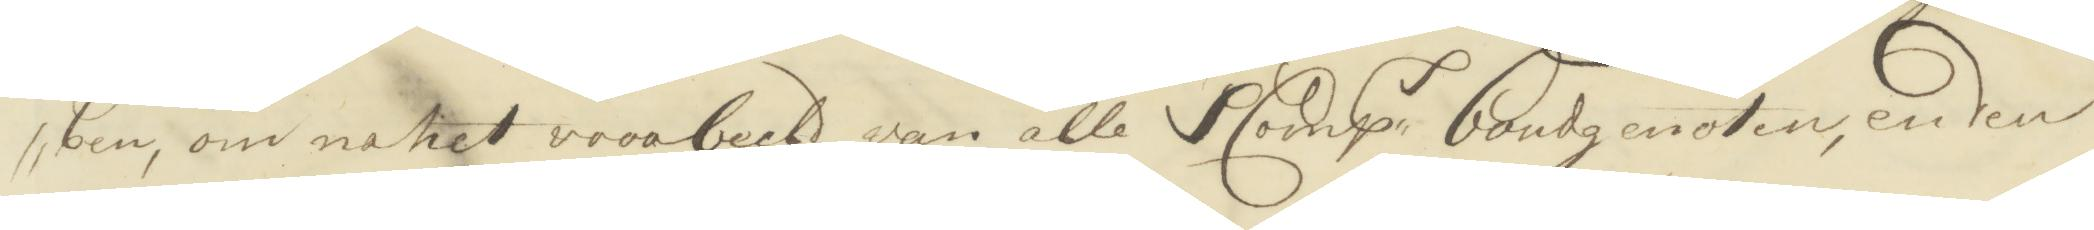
„ben, om na het voorbeeld van alle ’s Comp:s bondgenoten, en den
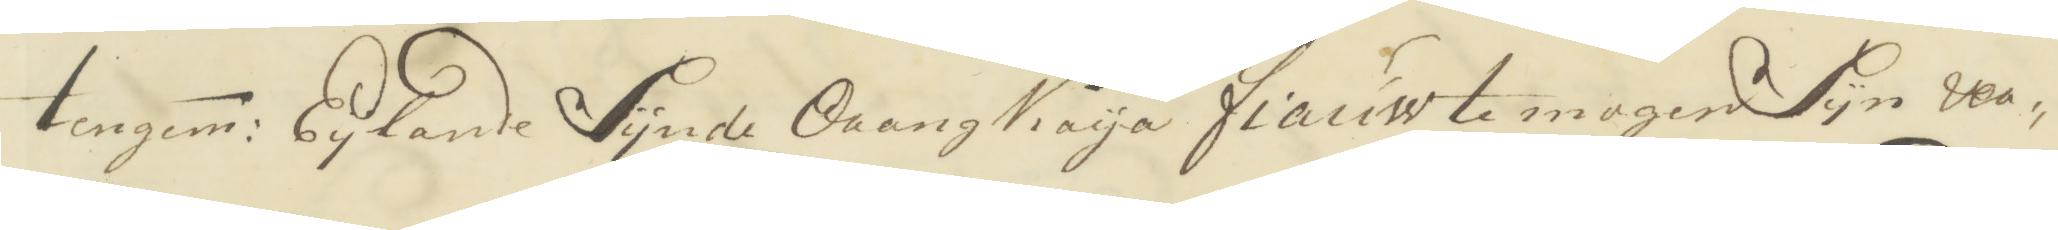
tengem: Eijlande sijnde Orang Kaija fiauw te mogen sijn ver„
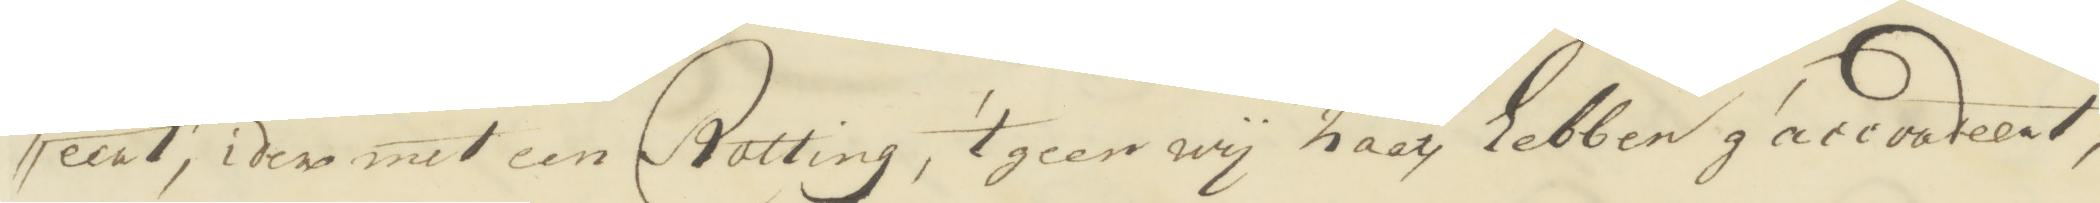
„eert, ider met een Rotting, ’t geen wij haar hebben g’accordeert
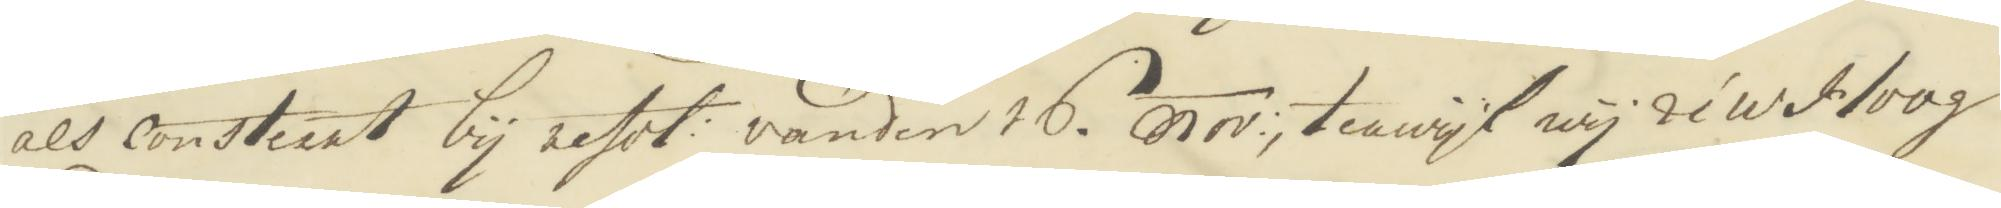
als consteert bij resol: van den 16. Nov:, terwijl wij uw Hoog
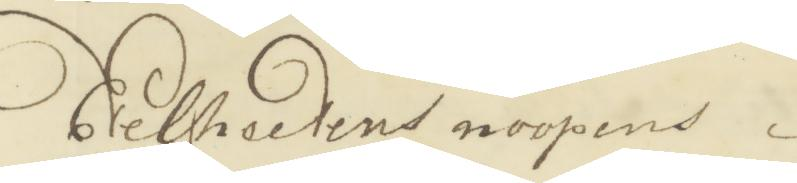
Edelheedens noopens -
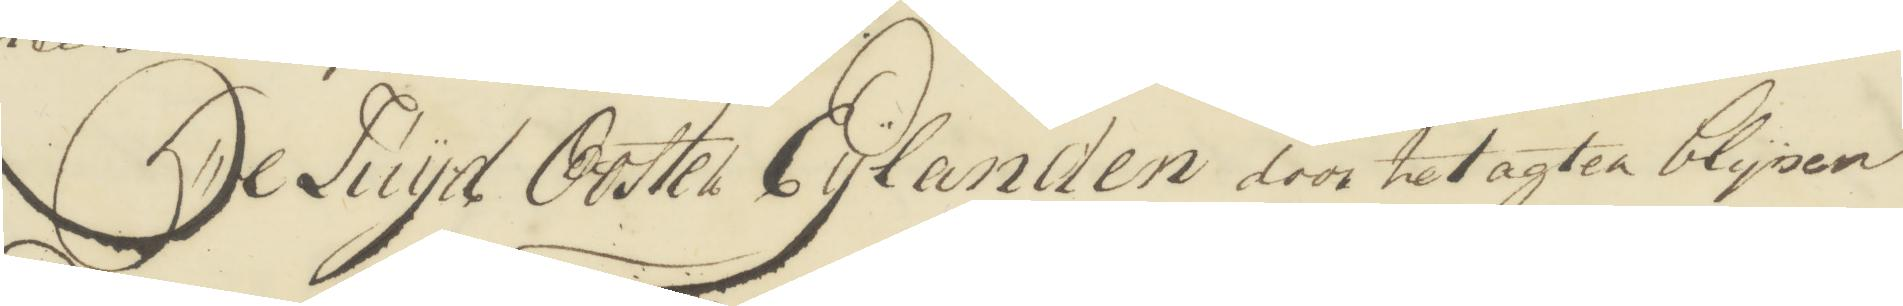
De Zuijd Ooster Eijlanden door het agter blijven
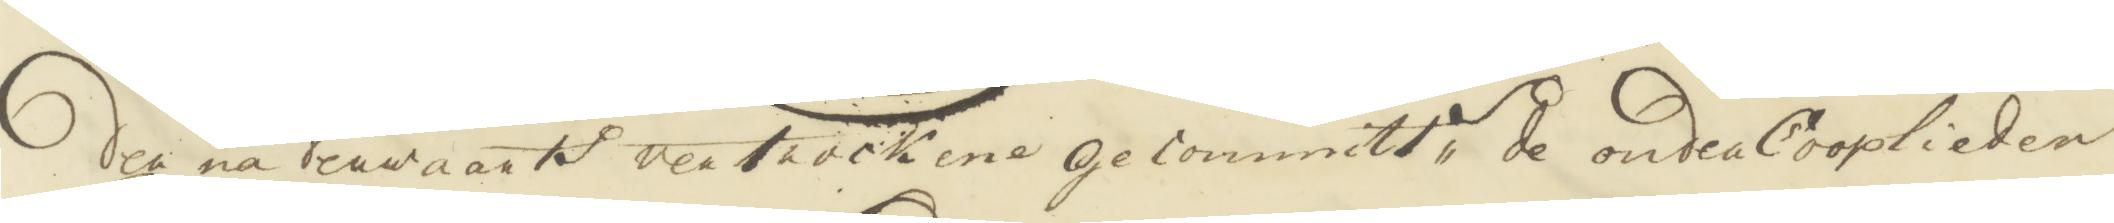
der na derwaarts vertrockene gecommitt„s de onderCooplieden
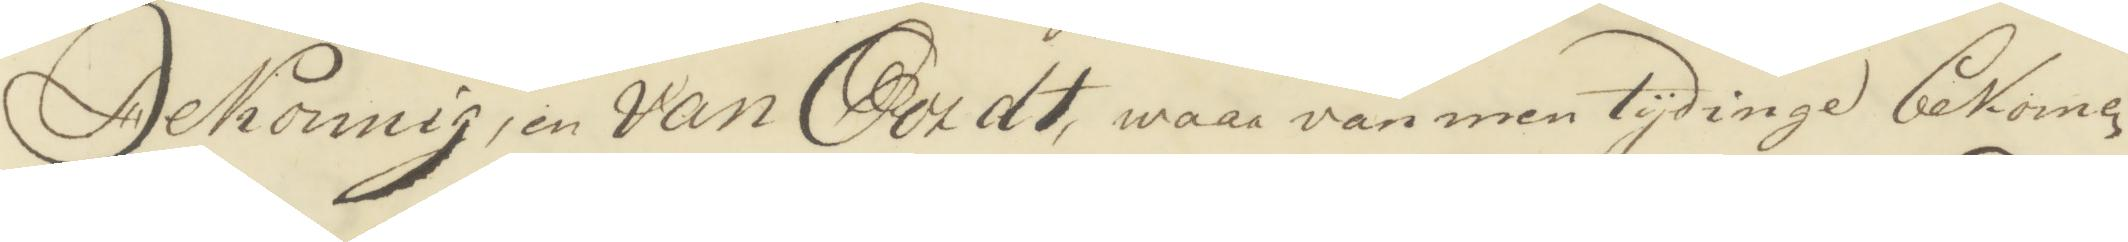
De konnig, en van Oordt, waar van men tijdinge bekomen
